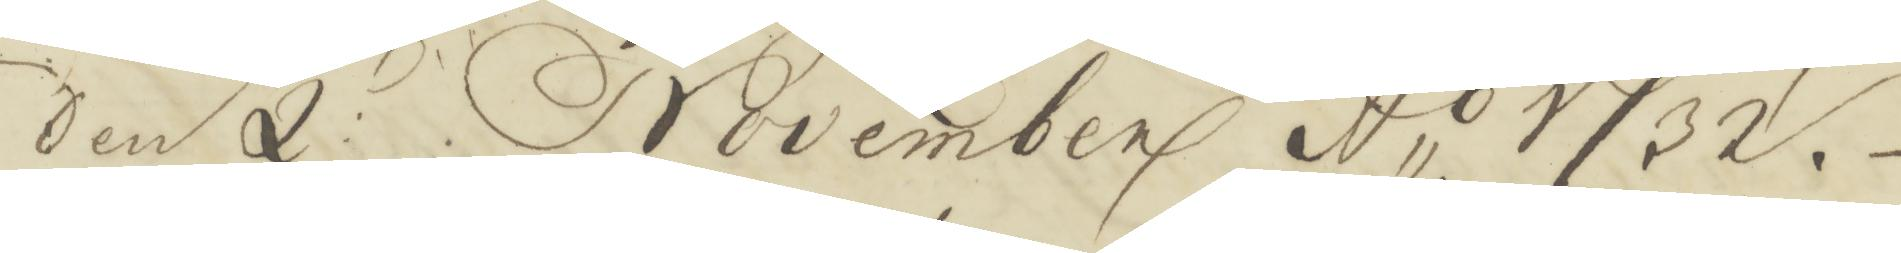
den 2:' November A„o 1732.-
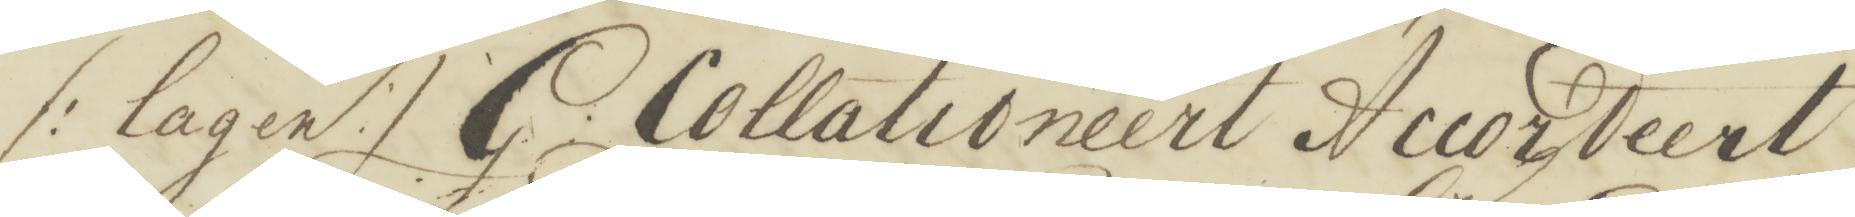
/: lager:/ G: Collationeert Accordeert
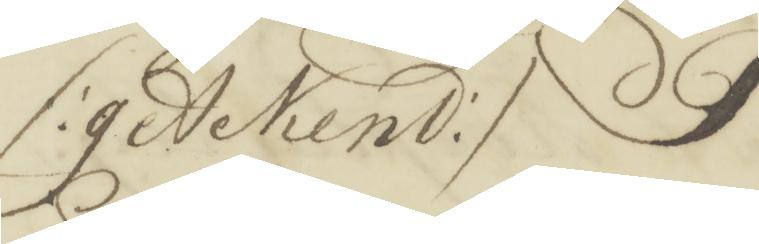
/:getekend:/
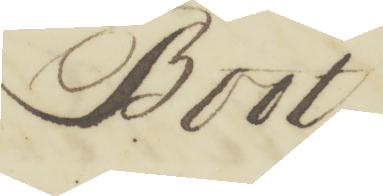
P:r Boot
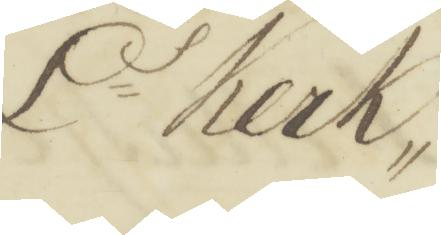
C:r L:s Kerk„
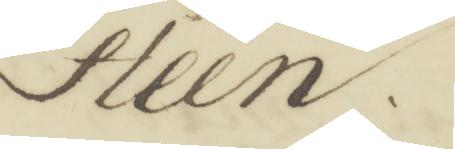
steen
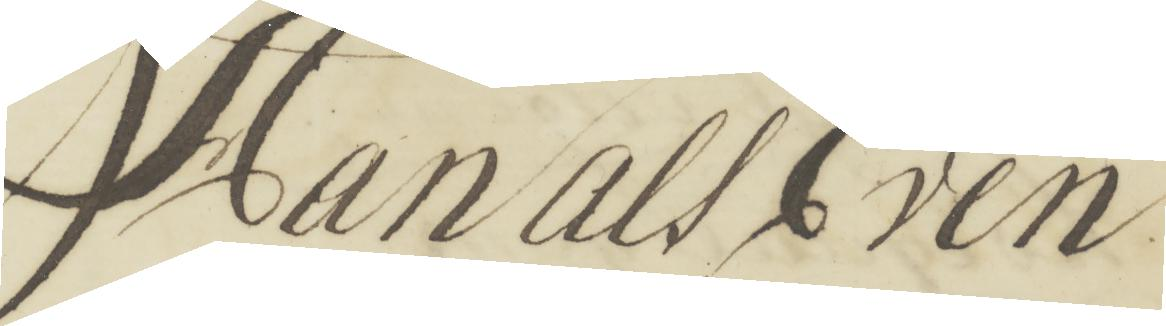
Aan als Even
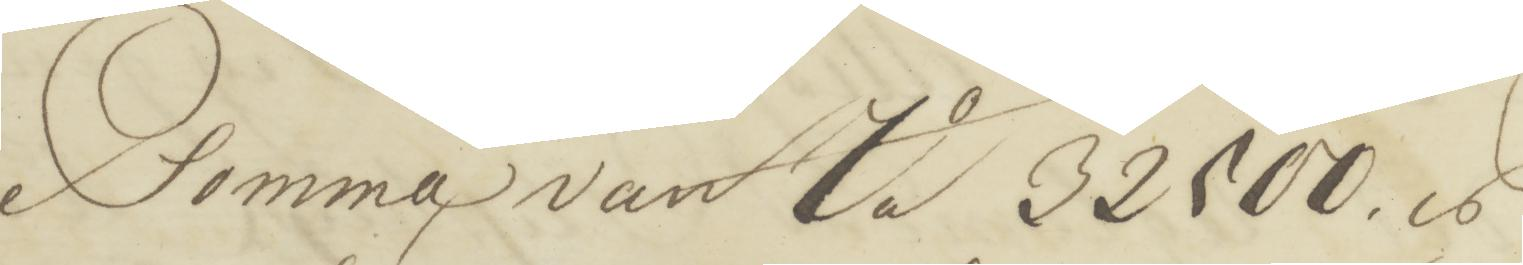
De Somma van r:o/a 32500. is
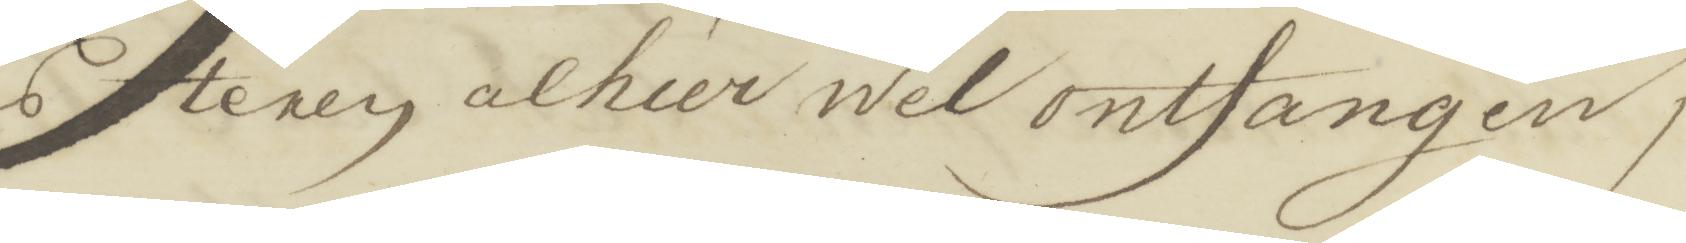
gisteren alhier wel ontfangen,
